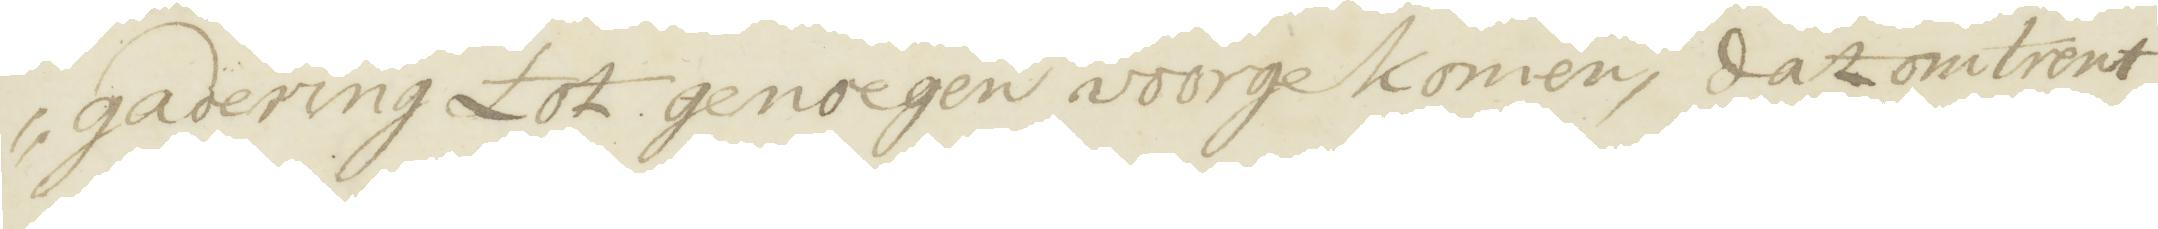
„gadering tot genoegen voorgekomen, dat omtrent
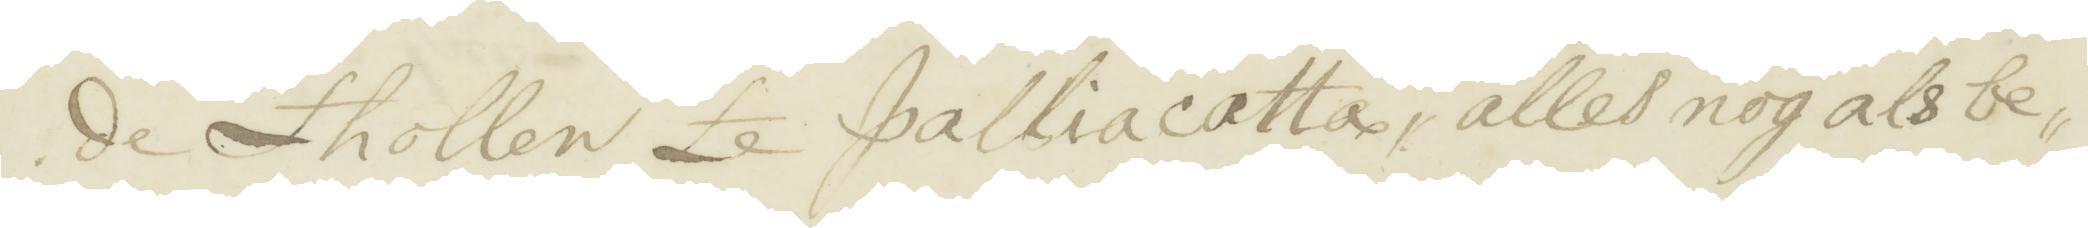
de thollen te palliacatta, alles nog als be„
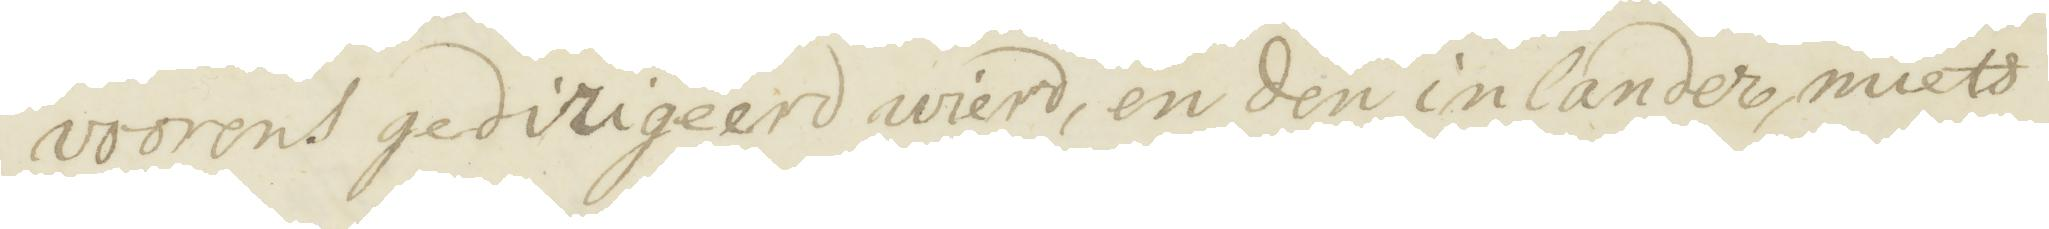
voorens gedirigeerd wierd, en den inlander, miets
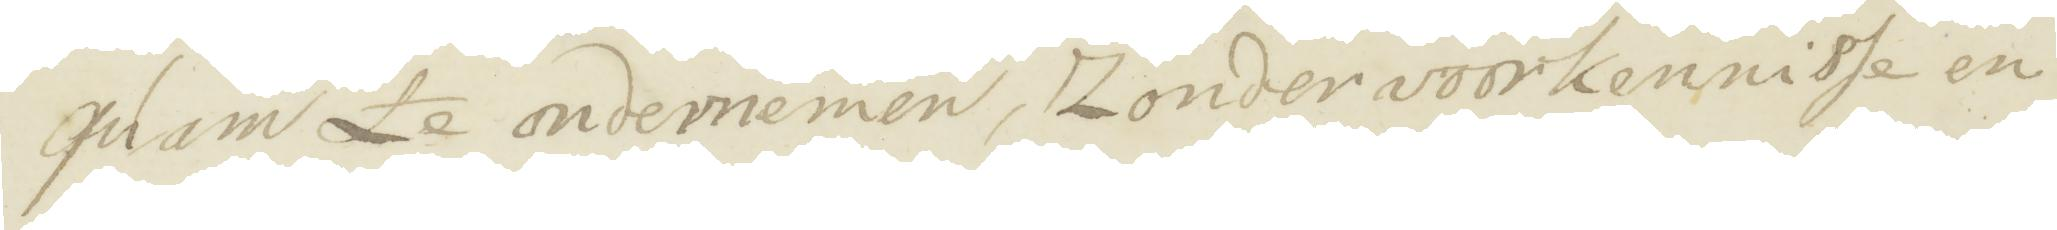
quam te ondernemen, zonder voorkennisse en
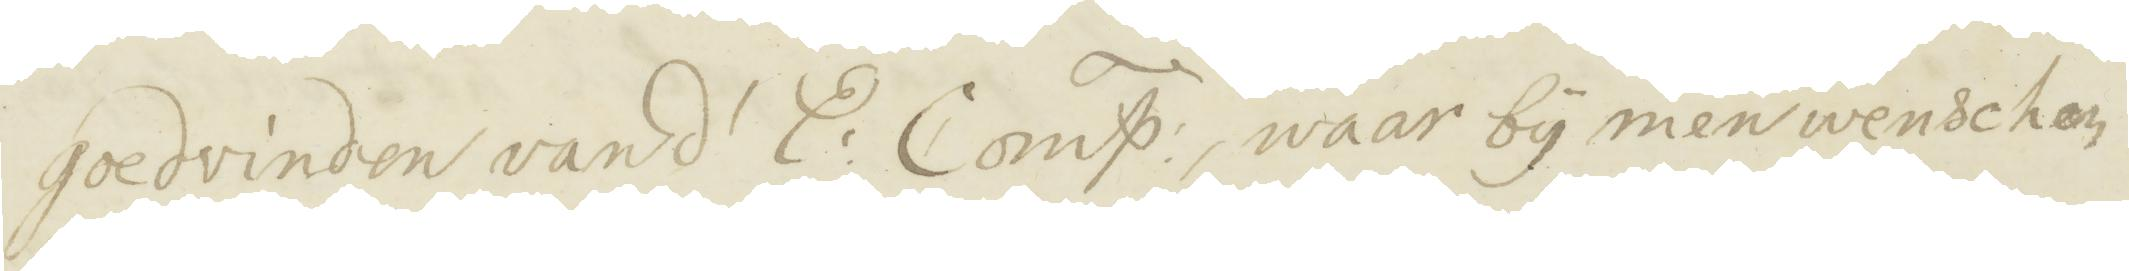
goedvinden van d’ E: Comp:, waar bij men wenschen
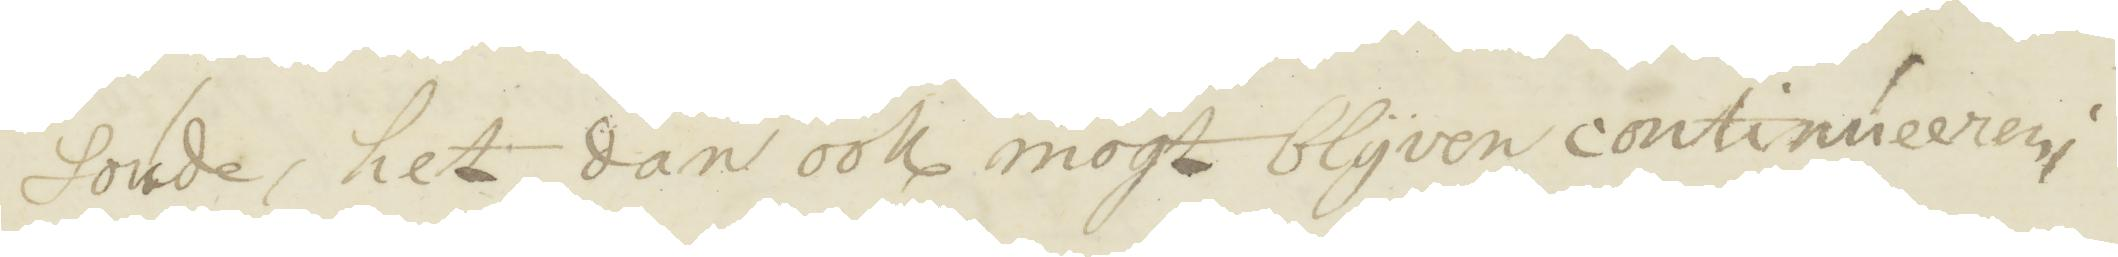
soude, het dan ook mogt blijven continueeren;
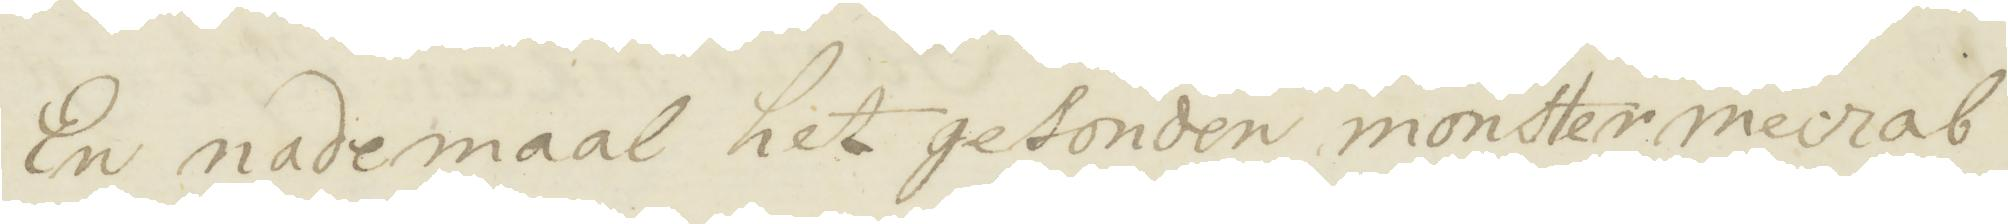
En nademaal het gesonden monster mecrab
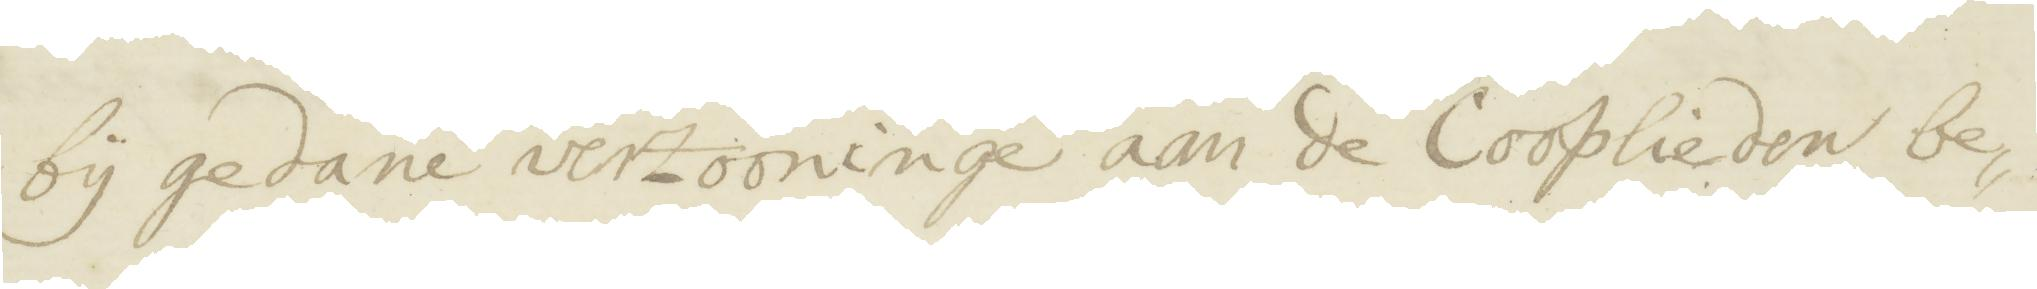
bij gedane verzooninge aan de Cooplieden be„
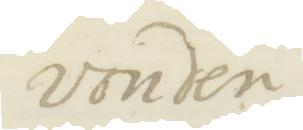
vonden
